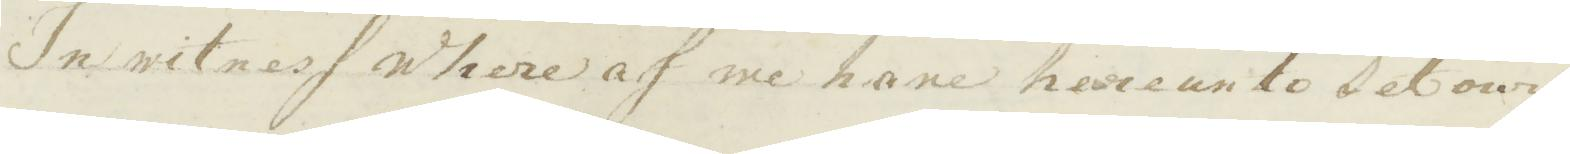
In witness where af we have hereunto set our
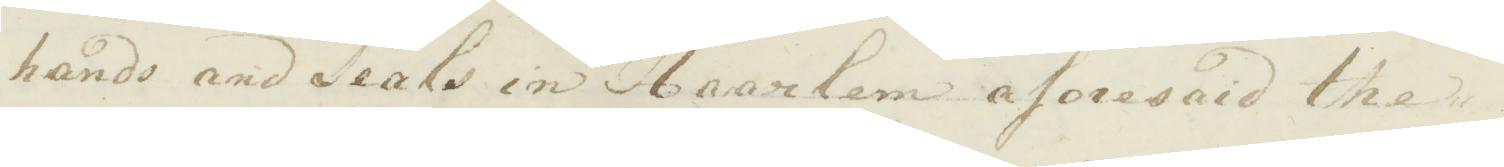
hands and seals in Haarlem aforesaid the„
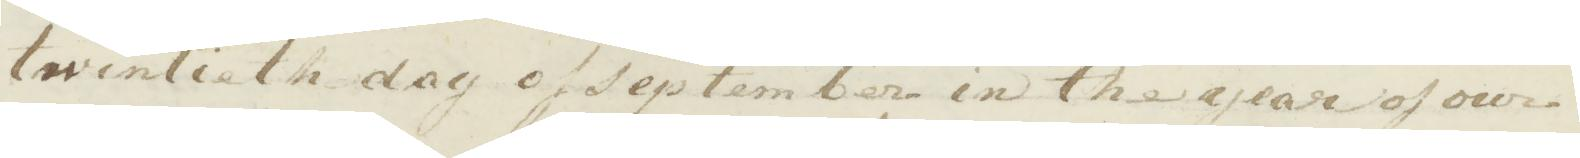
twintieth day of september in the year of our
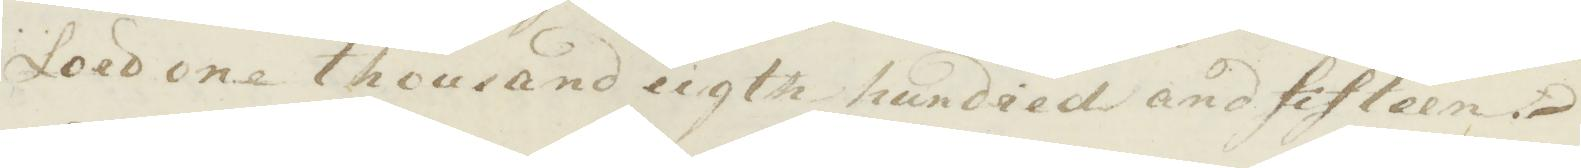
Lord one thousand eigth hundred and fifteen.
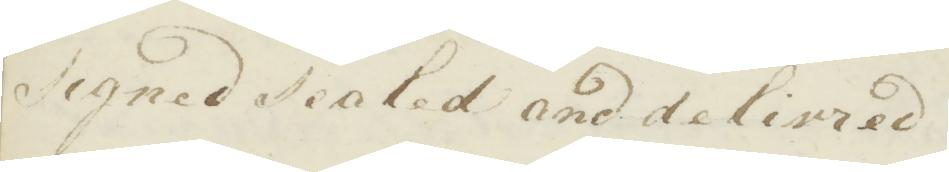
signed sealed and delivred
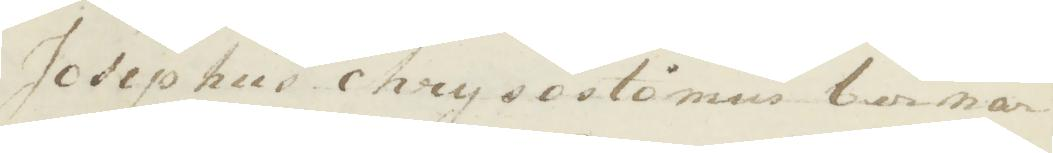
Josephus chrysostimus bernar
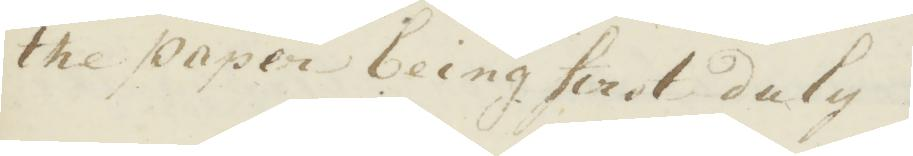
the paper being first duly
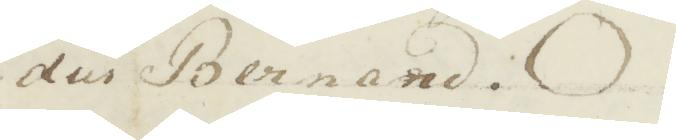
dus Bernandi. O
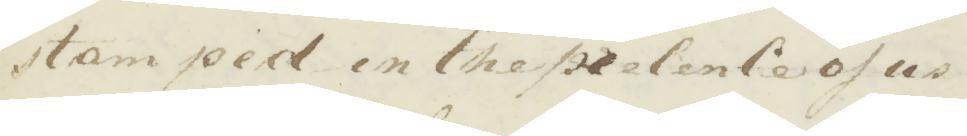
stamped in the precence of us
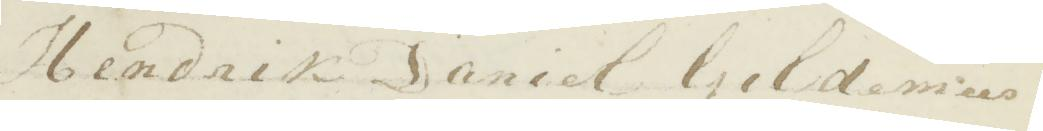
Hendrik Daniel Guldemees
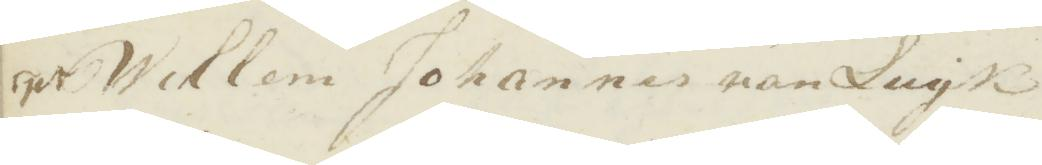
at Willem Johannes van Luijk
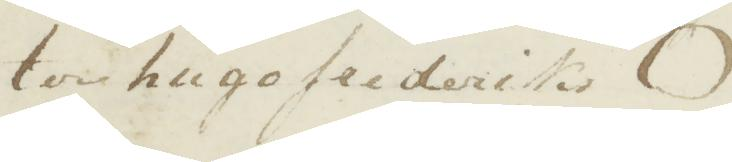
ter hugo frederik O
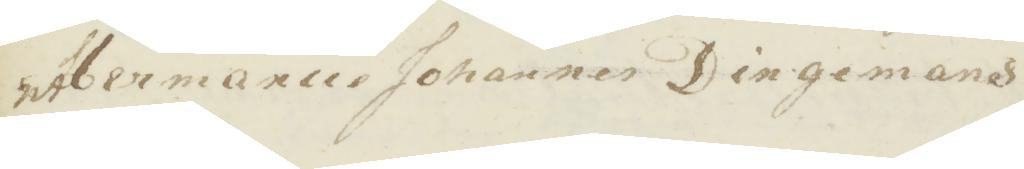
at Hermanus Johannes Dingemans
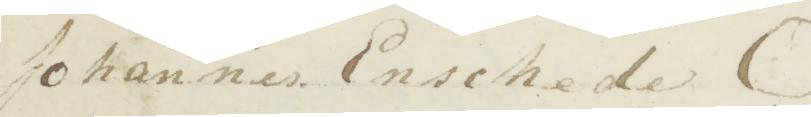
Johannes Enschede O
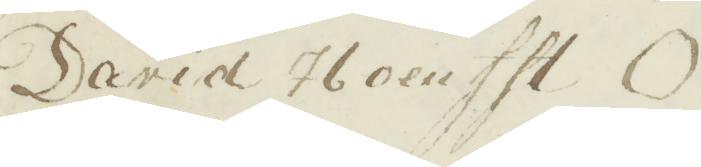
David Hoeufft O
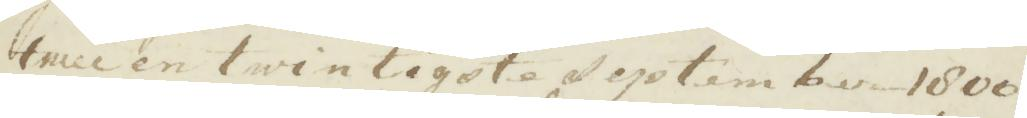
twee en twintigste september 1800
